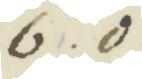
6. d
